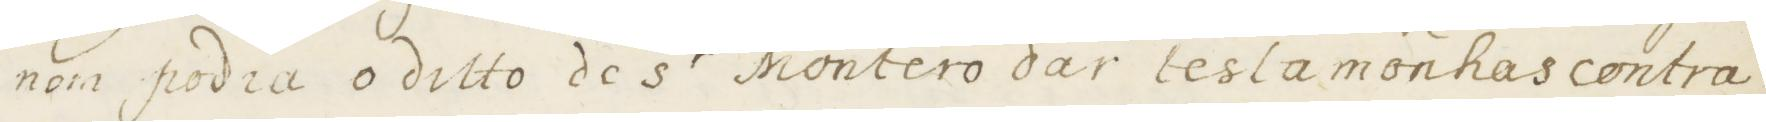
nom podia o ditto de sr Montero dar testamonhas contra
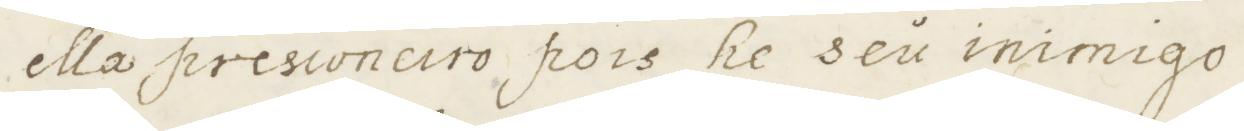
ella presioneiro pois he seu inimigo
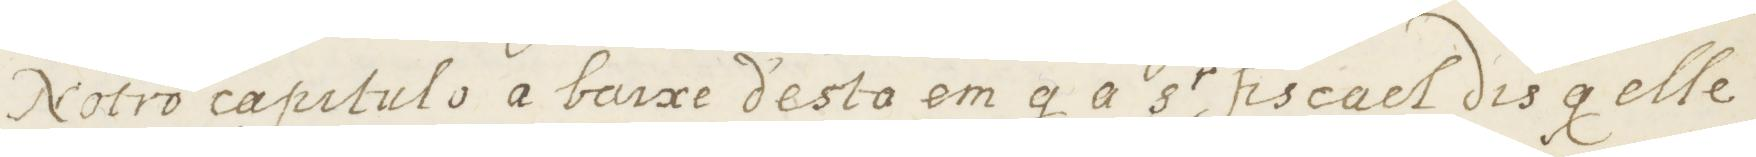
Notro capitulo a baixe d'esta em q a sr fiscael dis q elle
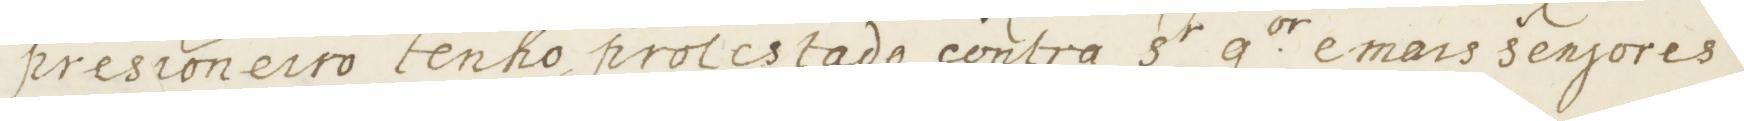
presioneiro tenho protestado contra sr g.or emais senjores
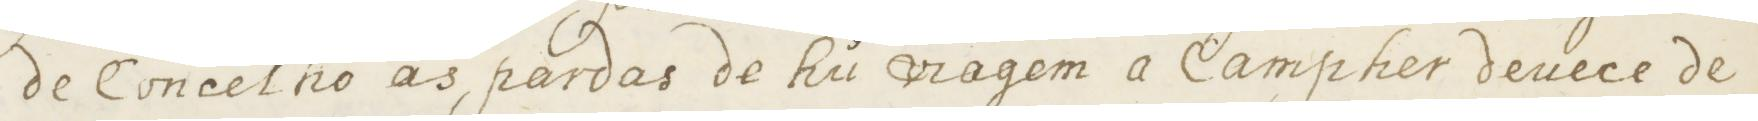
de Concelho as pardas de hu viagem a Campher denece de
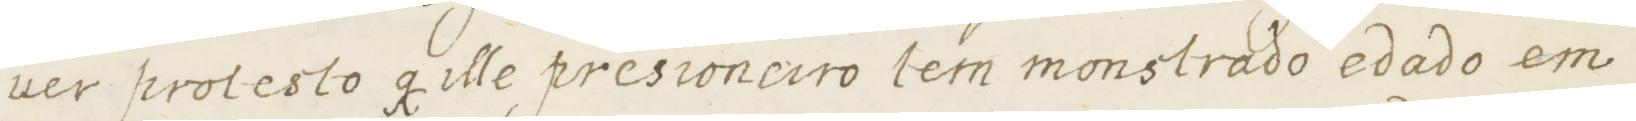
ver protesto q ille presioneiro tem monstrado edado em
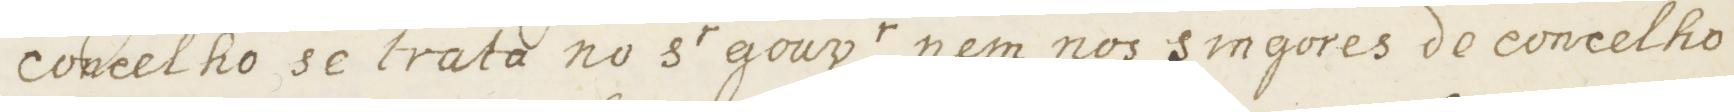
concelho se trata no sr gouvr nem nos singores de concelho
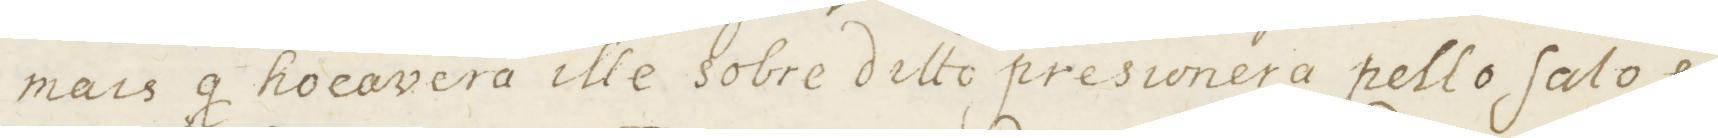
mais q ho cavera ille sobre ditto presionera pello sato e
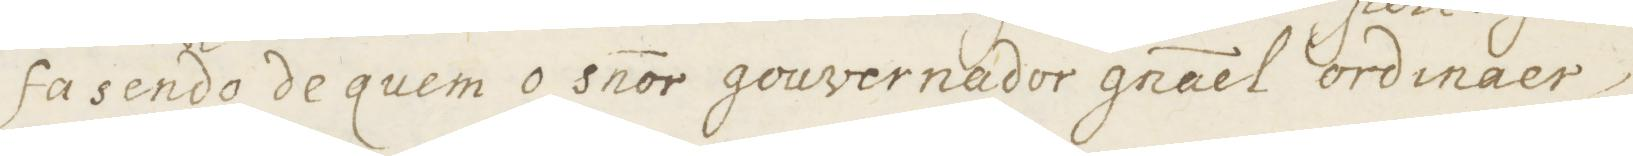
fasendo de quem o snor gouvernador gnael ordinaer,
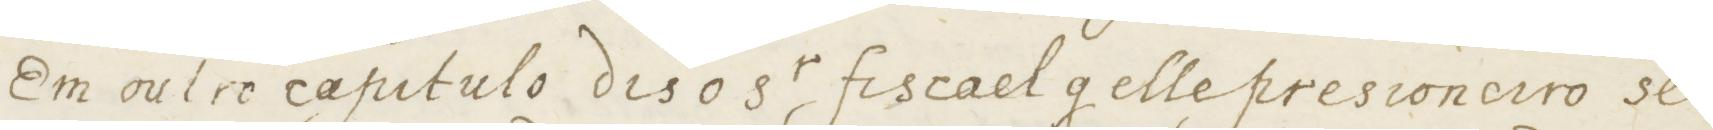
Em outro capitulo dis o sr fiscael q elle presioneiro se
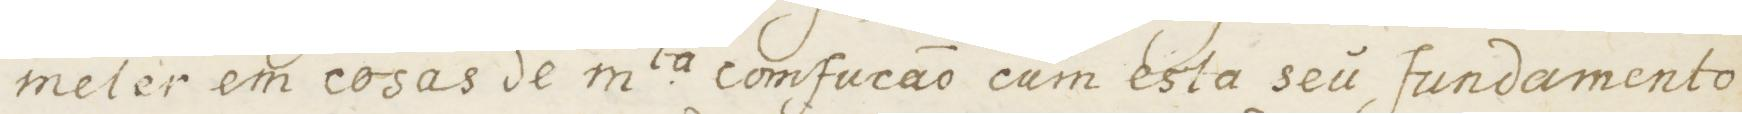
meter em cosas de m.ta comfucao cam esta seu fundamento
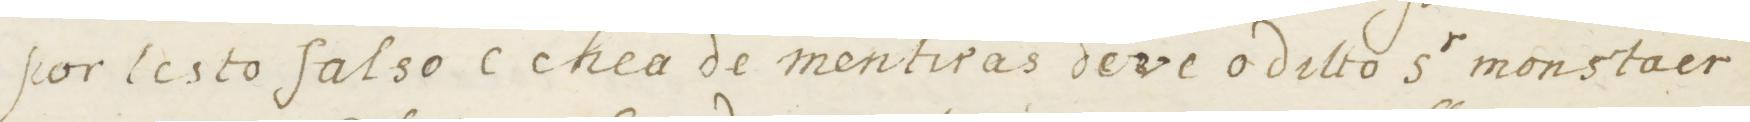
por testo falso e chea de mentiras deve oditto sr monstaer
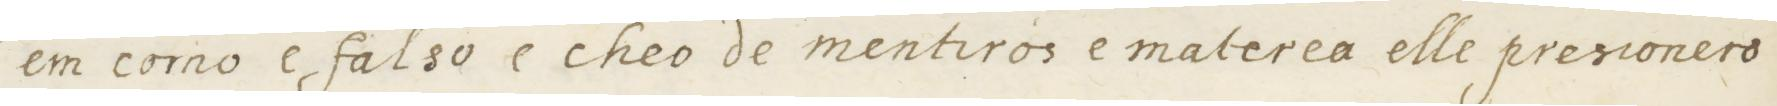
em como e falso e cheo de mentiros e materea elle presioners
